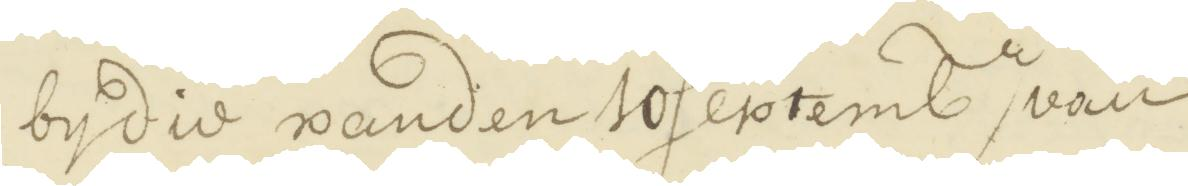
by die van den 10 septembr van
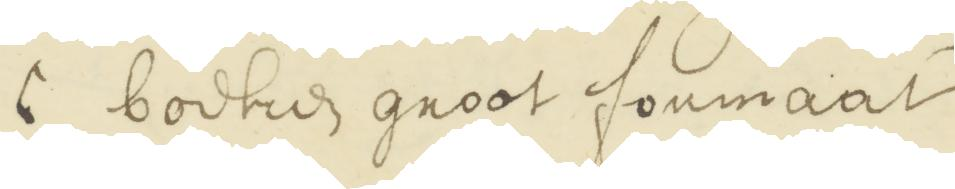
5 boeken groot formaat
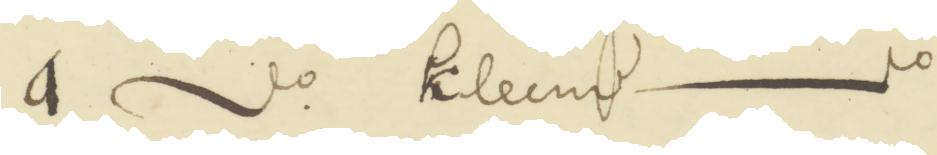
4 _.o kleene _4 d:o kleene _o
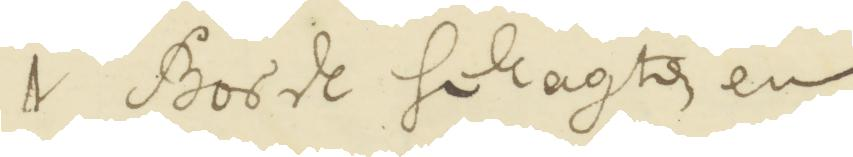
1 Bosch schagten en
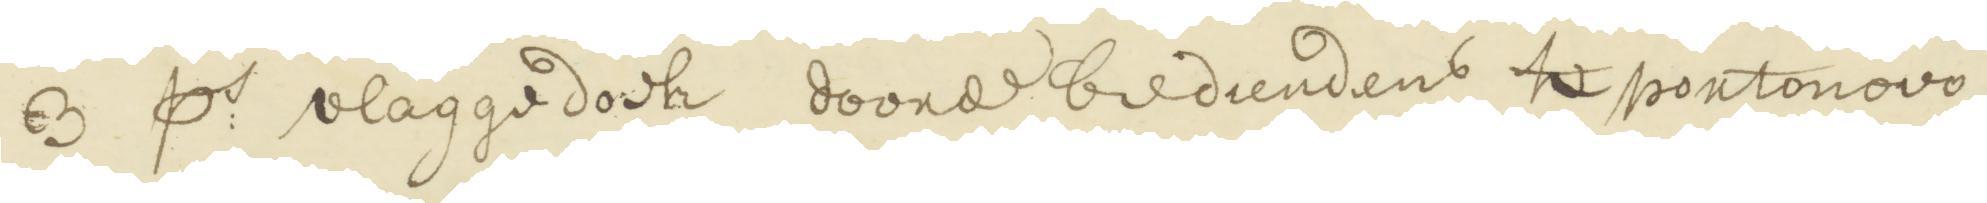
3 p:s vlagge doek door de bediendens te portonovo
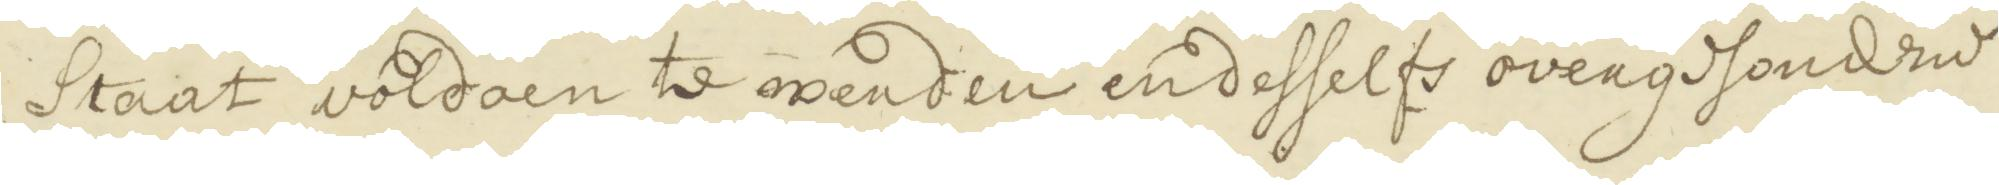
staat voldaen te werden en desselfs overgesondene
